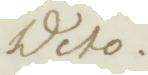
Dito. . . . . . . . .
